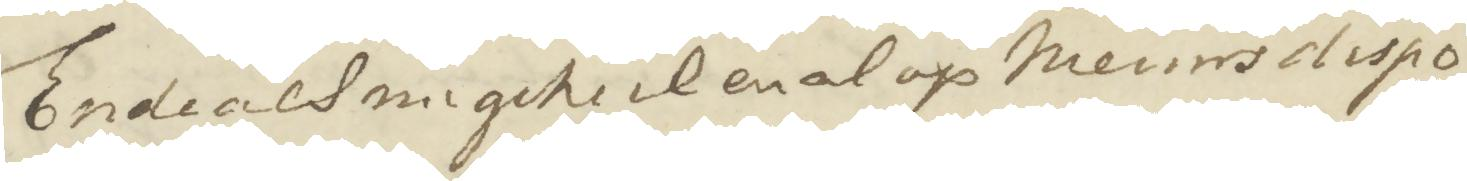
Ende als nu geheel en al op nieuws dispo
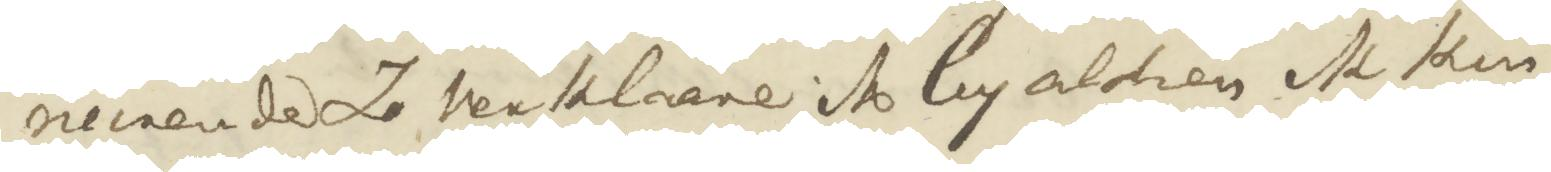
neerende Zo verklaare ik by aldien ik kin
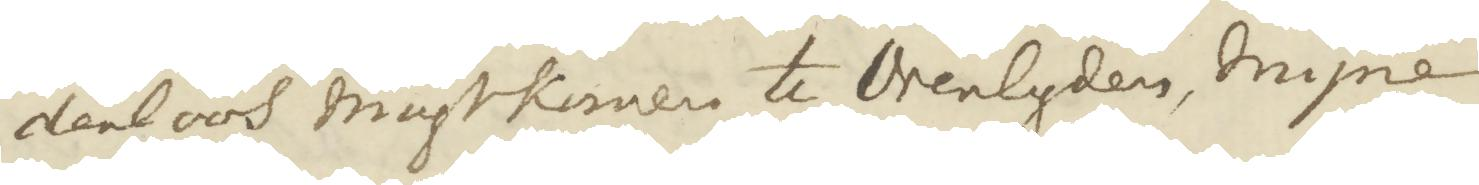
derloos mogtkomen te Overlyden, myne
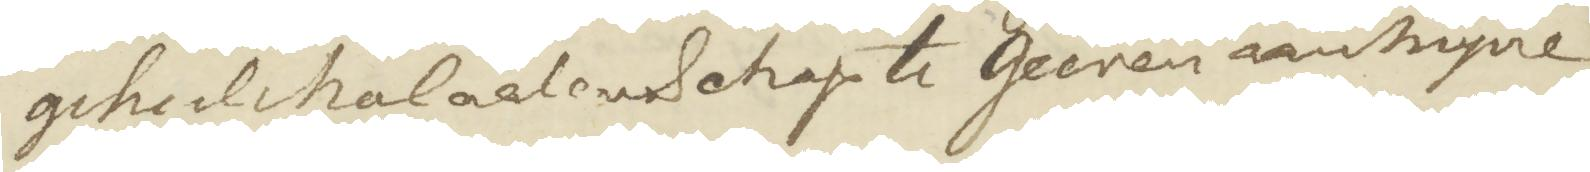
geheele nalaatenschap te geeven aan myne
